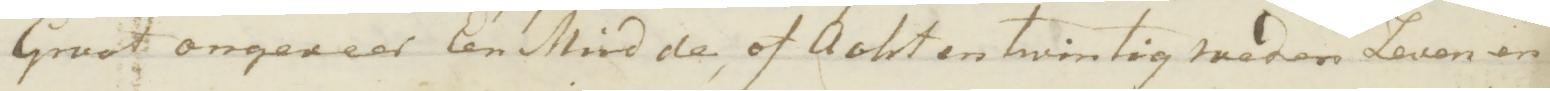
Groot ongeveer Een Mudde, of Acht en twintig roeden Zeven en
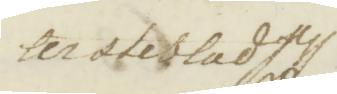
eerste bladzij
